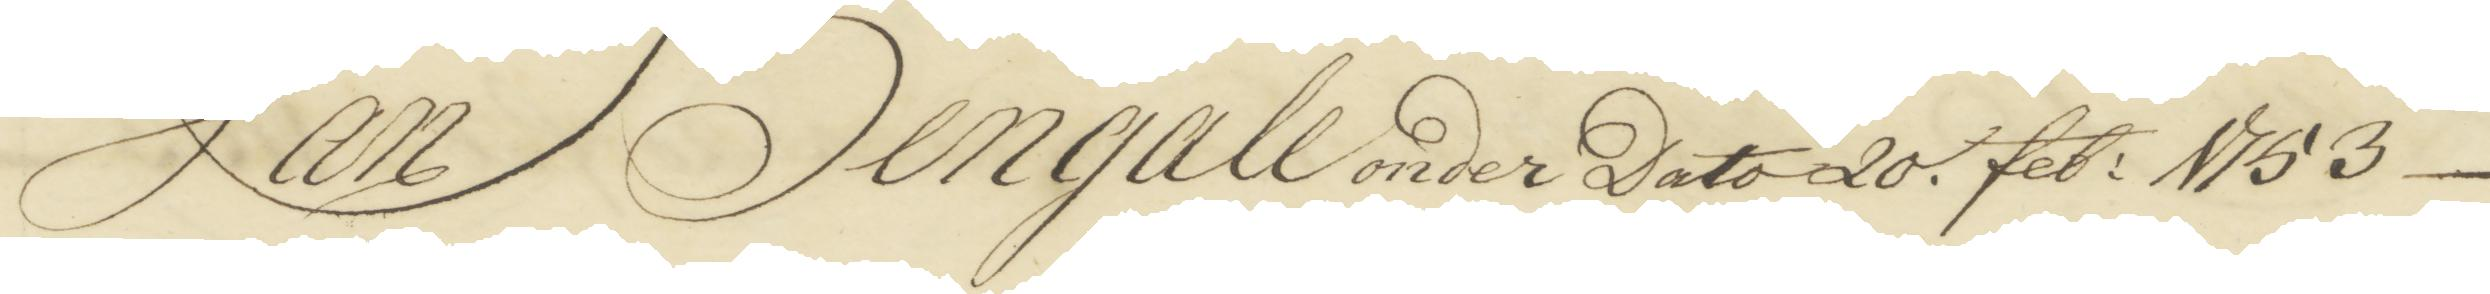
Van Bengale onder Dato 20:' feb: 1753—
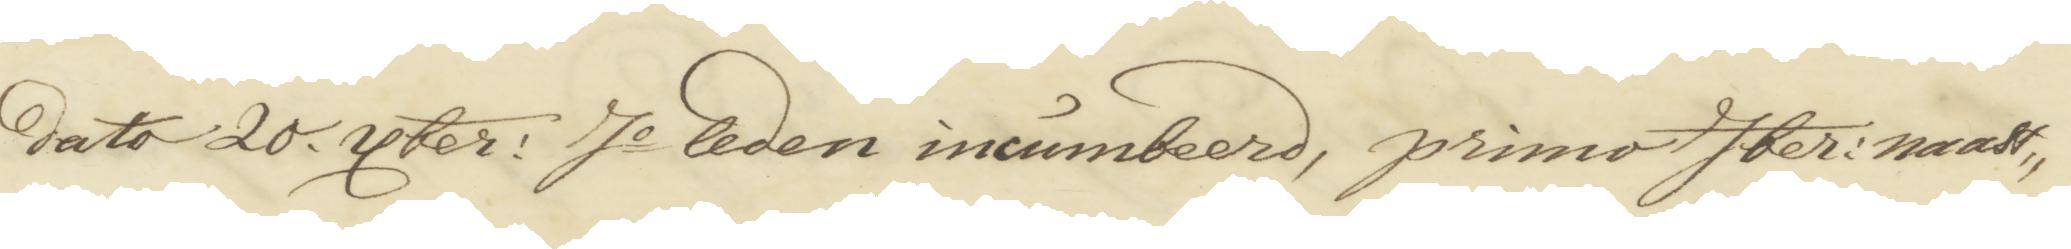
dato 20: xber: J=o leden incumbeerd, primo Jber: naast„
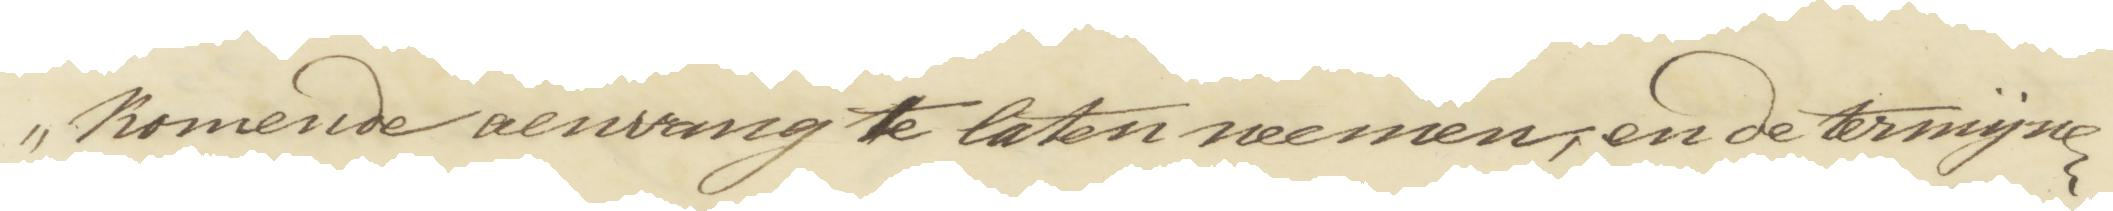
„Komende aenvang te laten neemen, en de termijnen
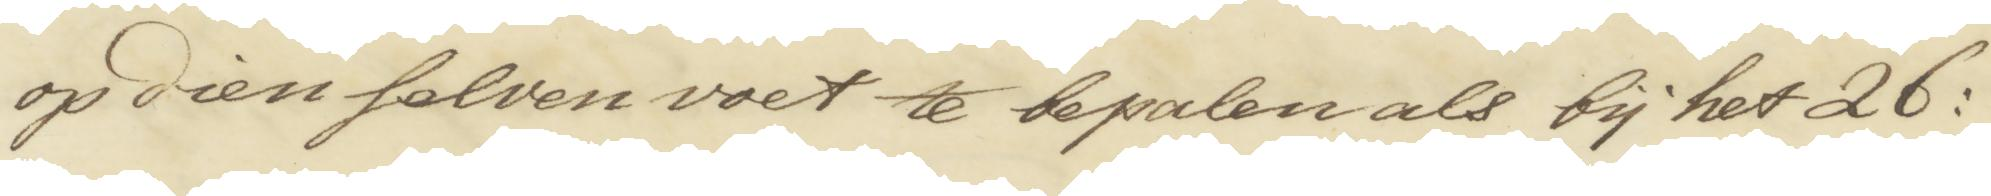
op dien selven voet te bepalen als bij het 26:
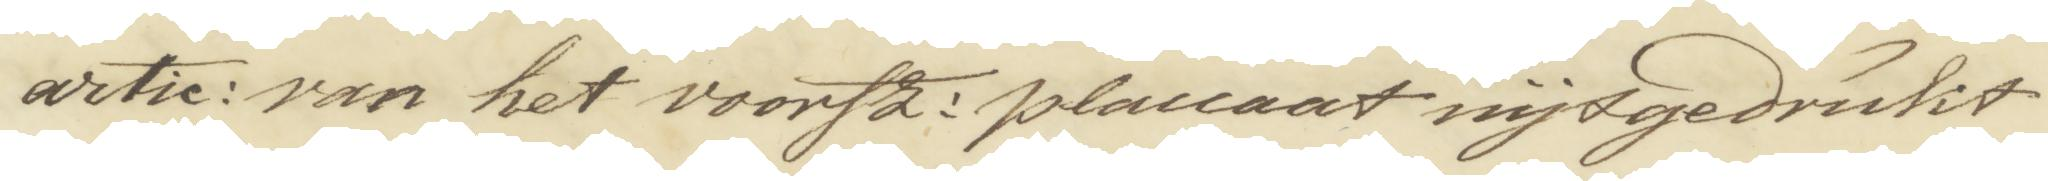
artic: van het voorsz: placcaat uijtgedrukt
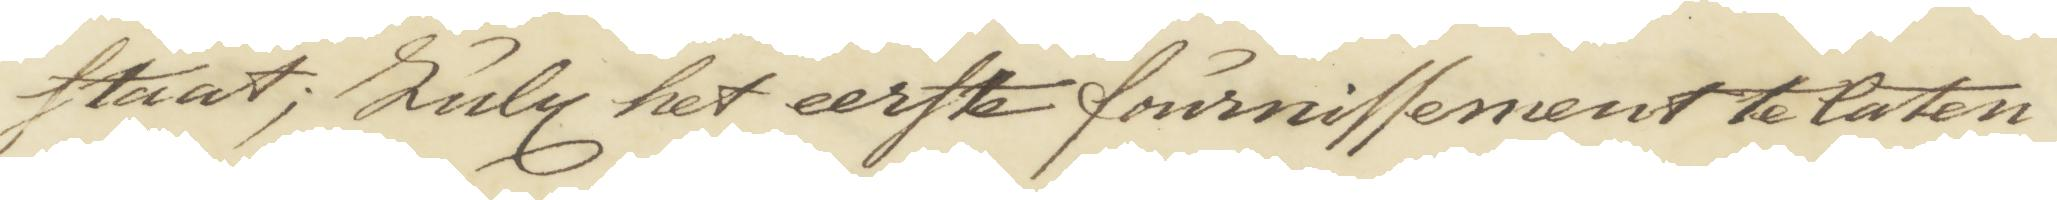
staat; Zulx het eerste fournissement te laten
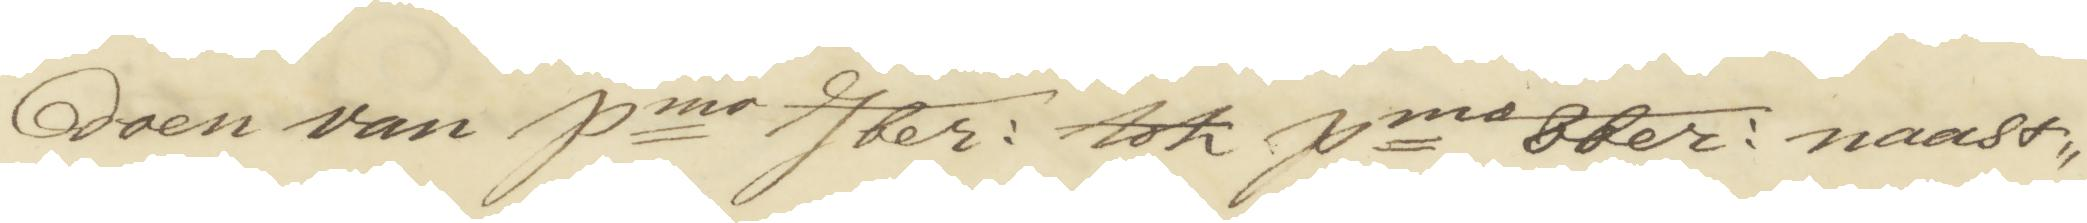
doen van p=mo 7ber: tot p=mo 8ber: naast„
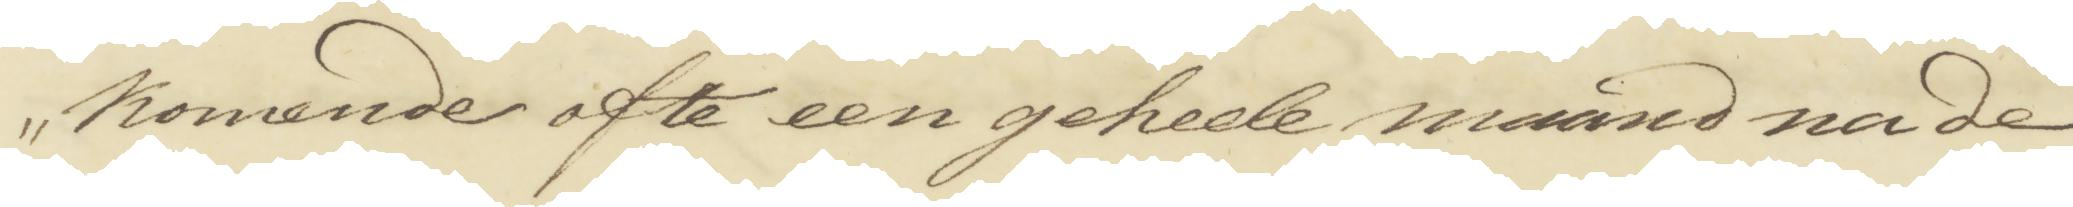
„Komende ofte een geheele maand na de
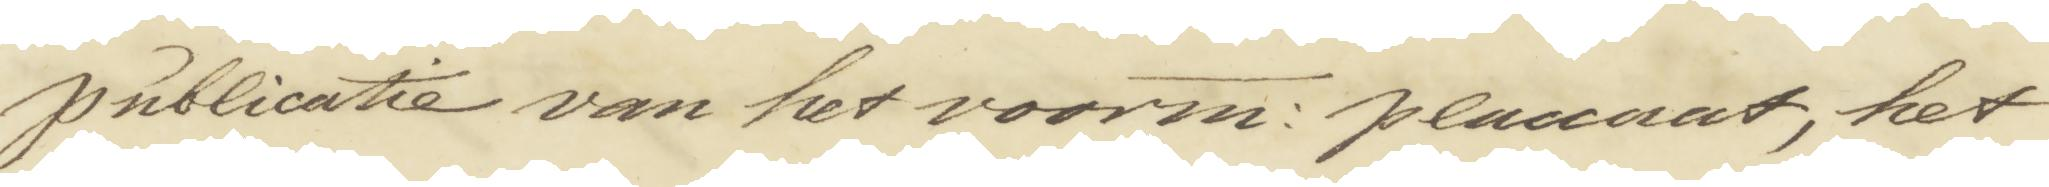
publicatie van het voorm: placcaat, het
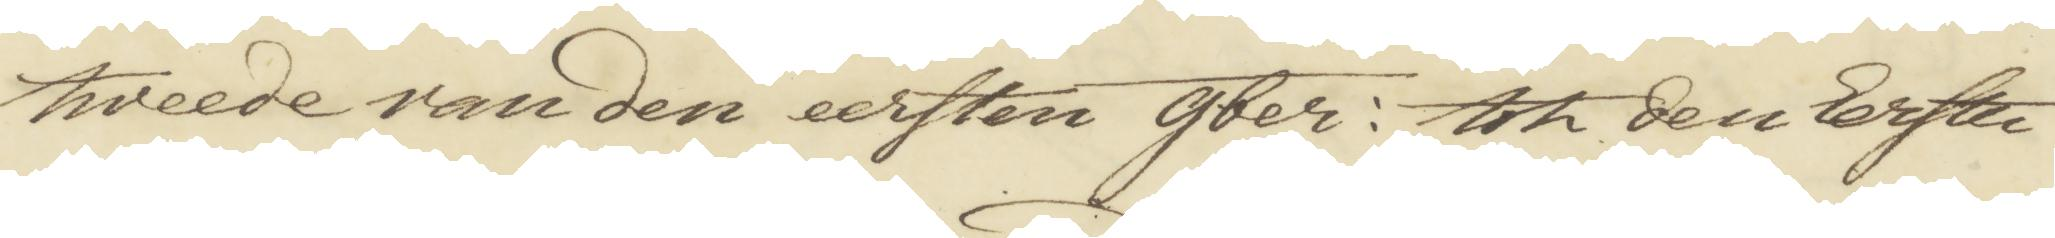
tweede van den eersten gber: tot den Eerste
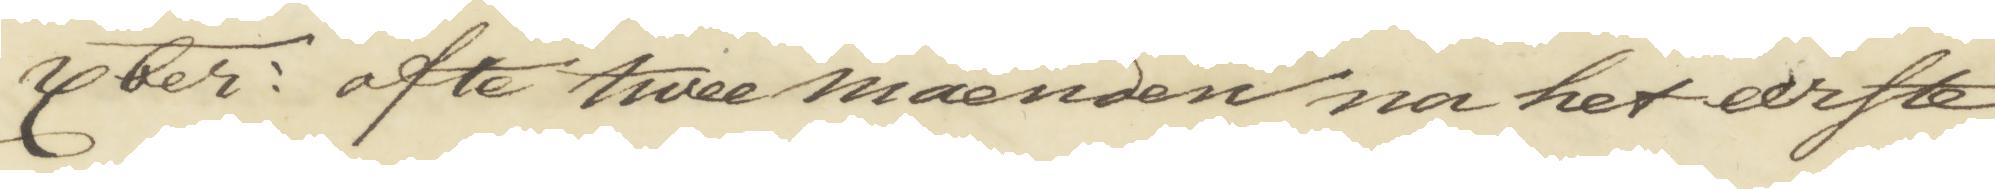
xber: ofte twee maenden na het eerste
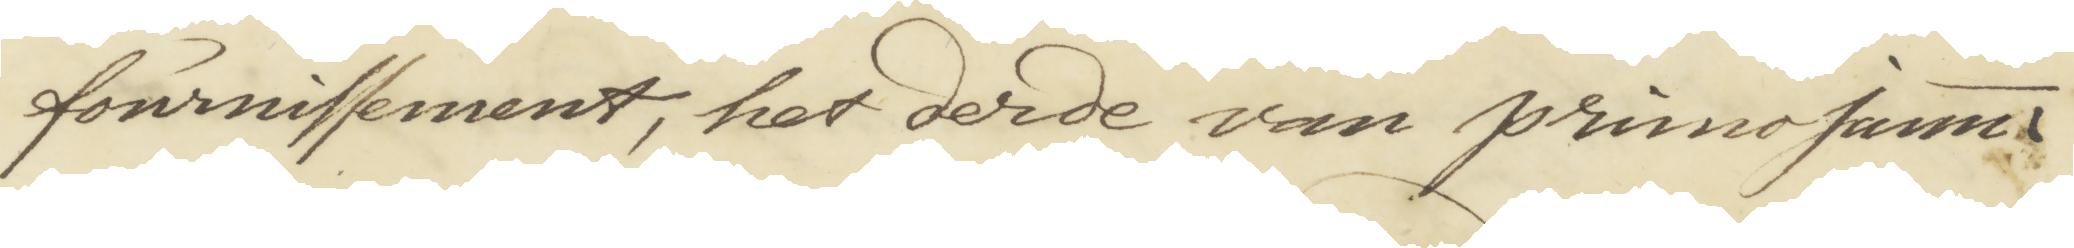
fournissement, het derde van primo jann:
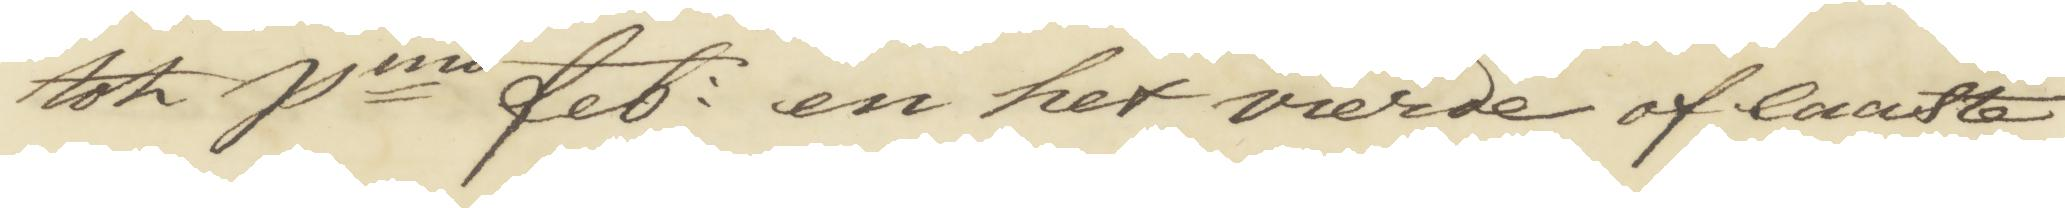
tot p=mo feb: en het vierde of laaste
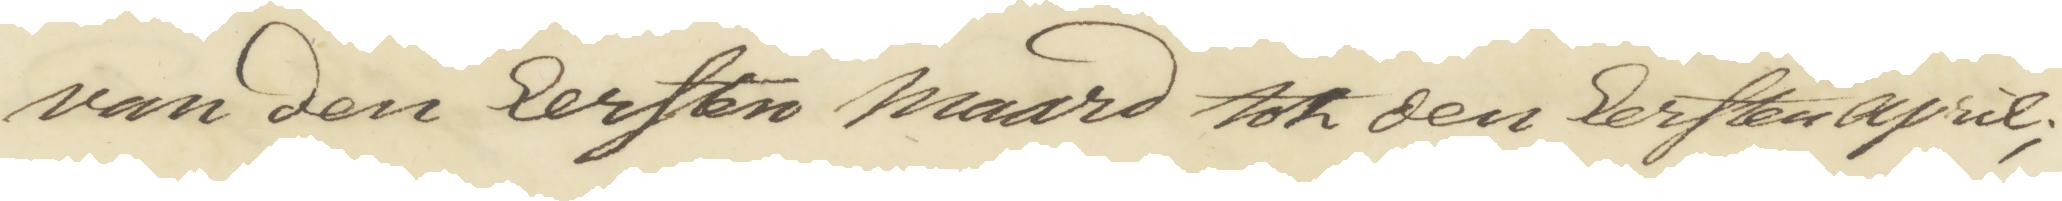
van den Eersten maard tot den Eersten april;
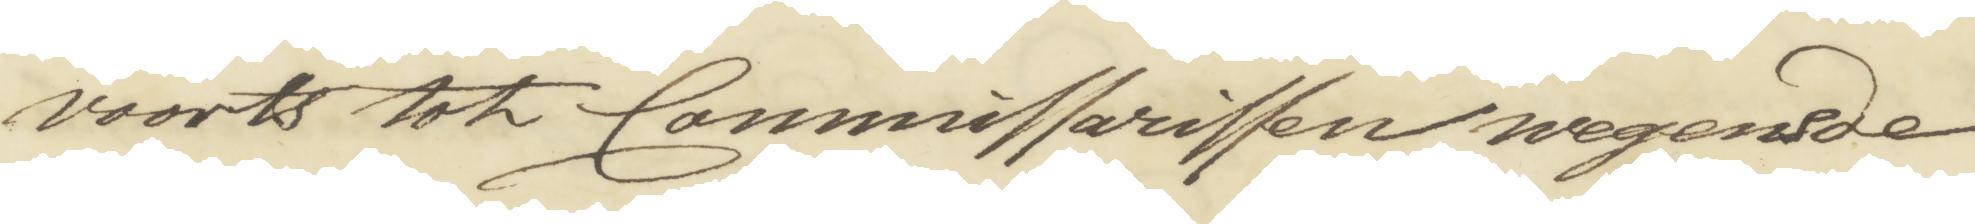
voorts tot Commissarissen wegens de
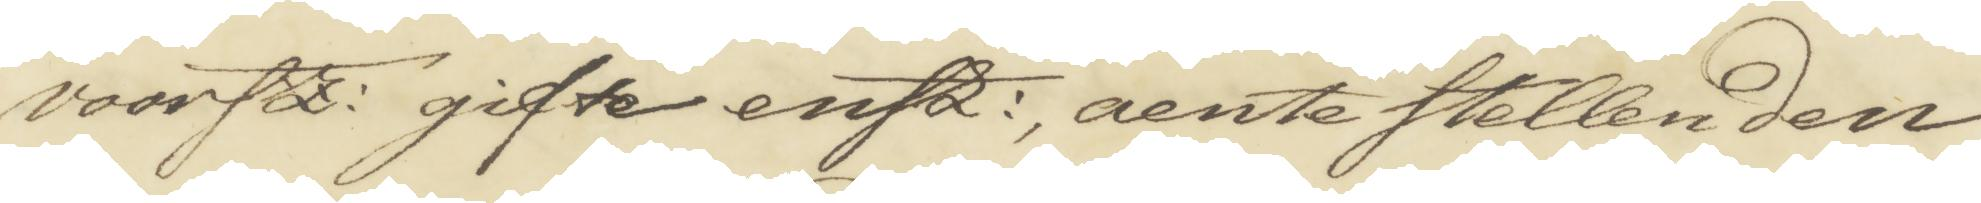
voorsz: gifte ensz:, aente stellen den
